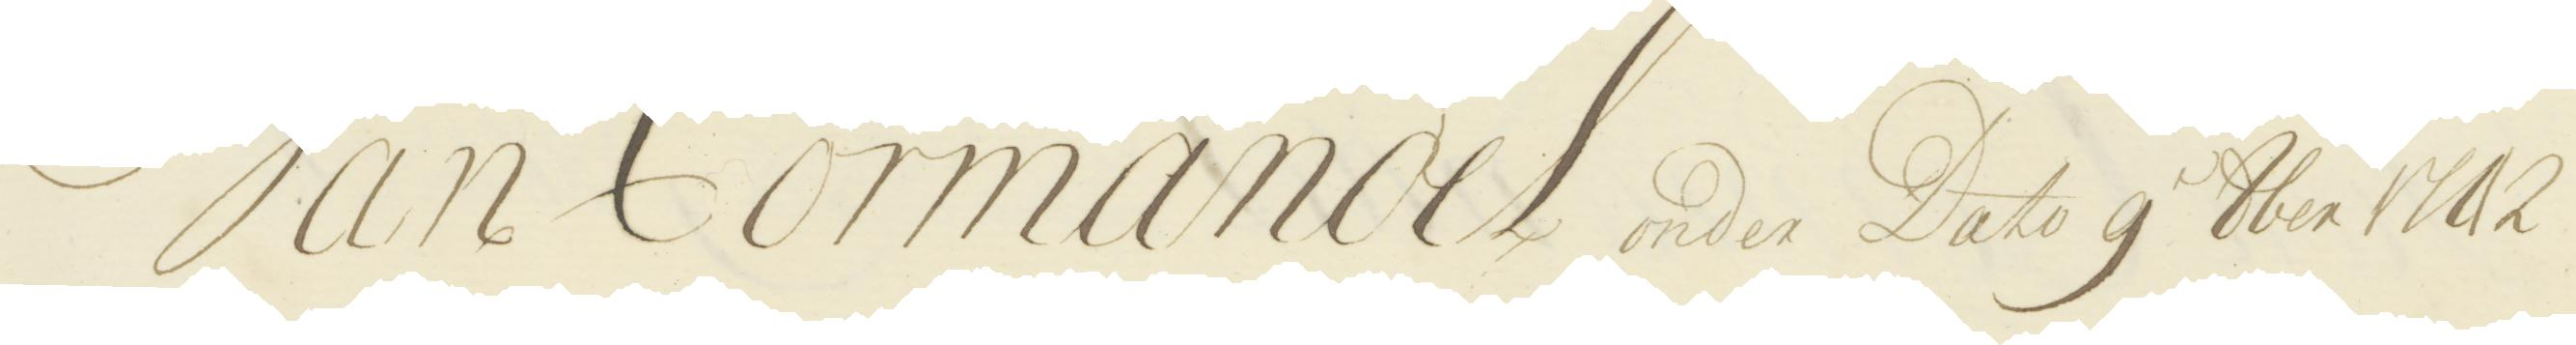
Van Cormandel onder Dato 9' 8ber 1742
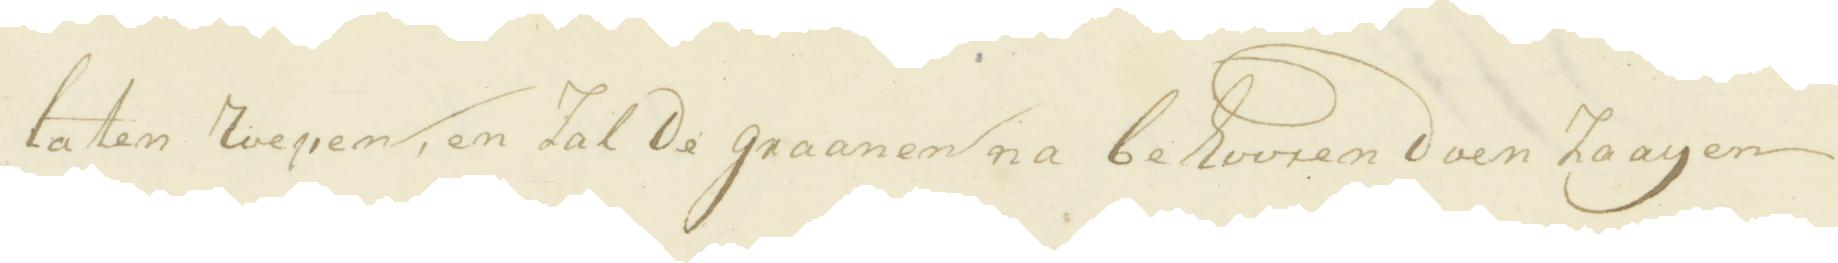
laten roepen, en zal de graanen na behooren doen zaayen
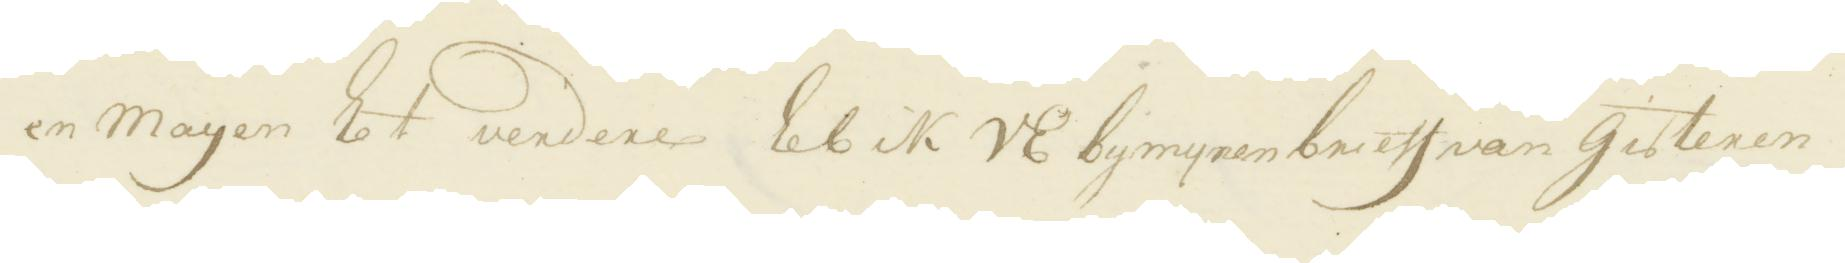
en mayen het verdere heb ik VE by mynen brieff van gisteren
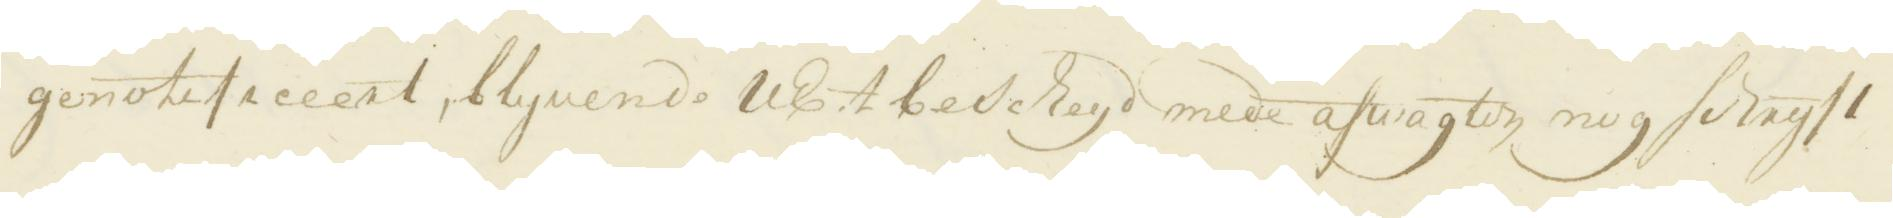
genotificeert, blyvende UE t bescheyd mede afwagten nog schryft
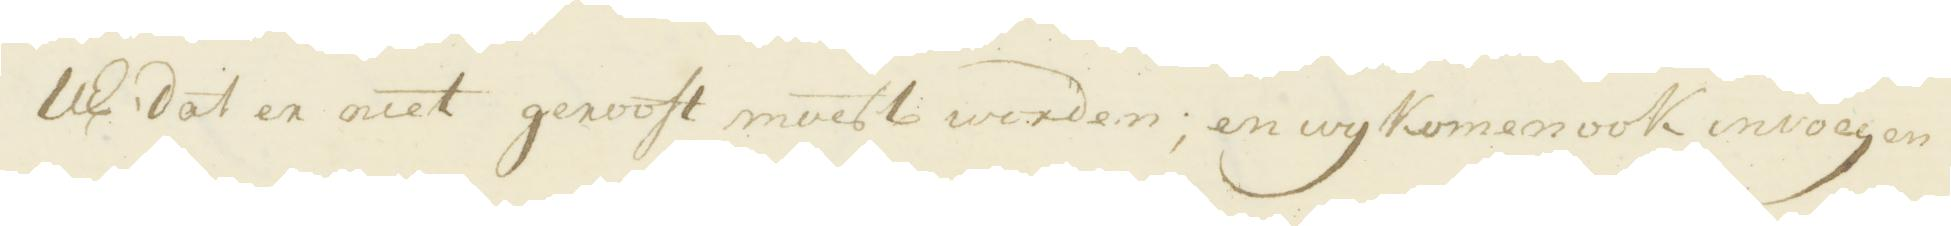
UE dat er niet gerooft moest worden; en wy komen ook invoegen
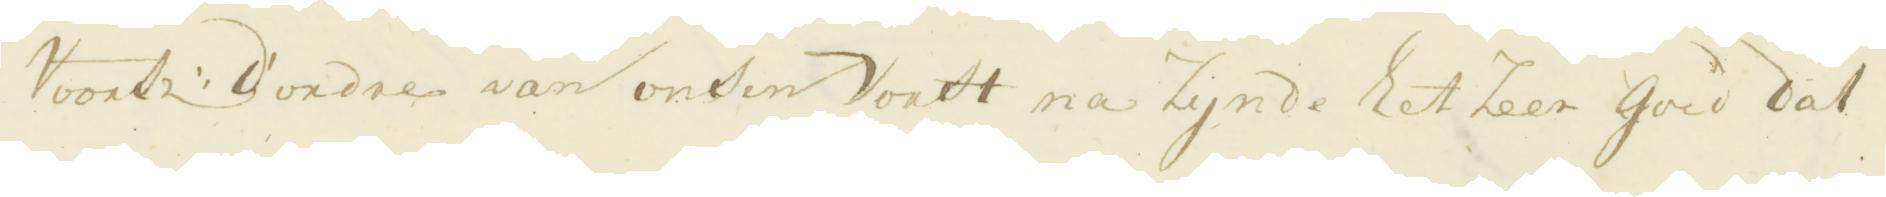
Voorsz: d'ordre van onsen Vorst na zynde het zeer goed dat
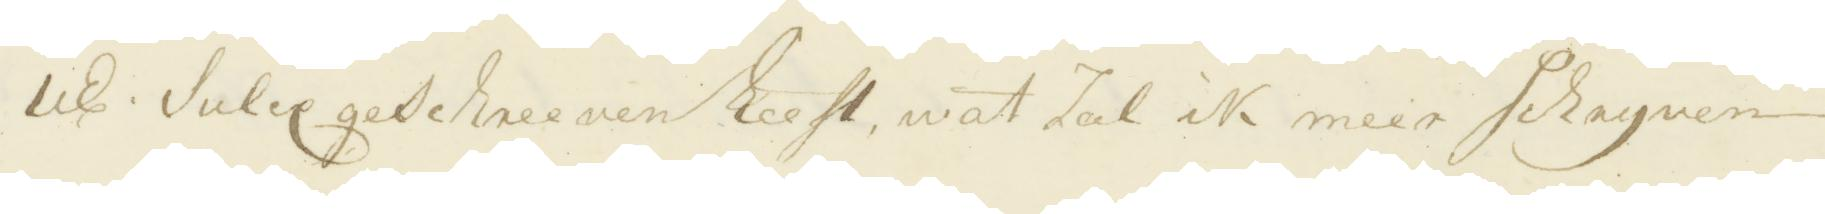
UE: sulx geschreeven heeft, wat zal ik meer schryven
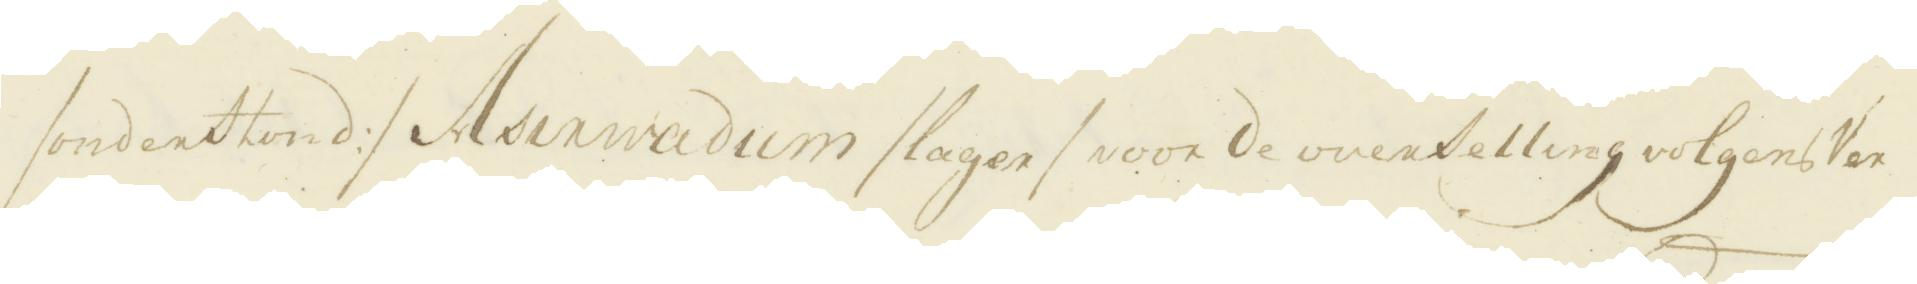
/onderstond:/ Aserwadum /lager/ voor de oversetting volgens ver
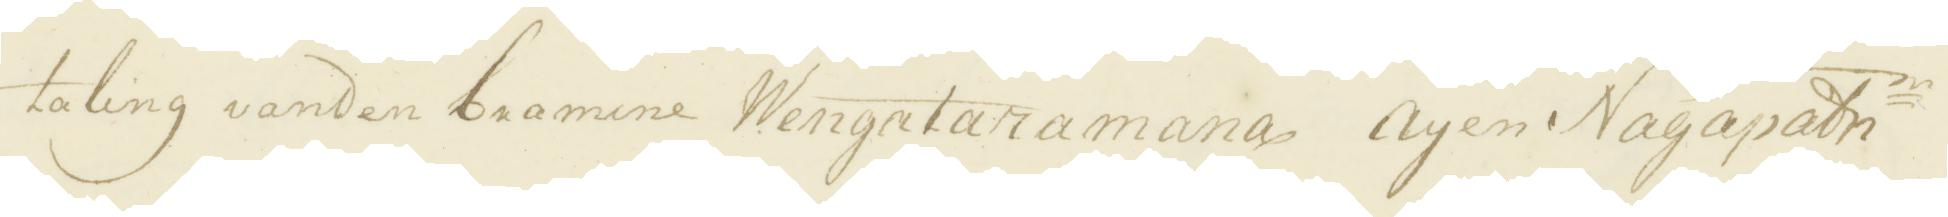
taling vanden bramine Wengataramana ayen Nagapatn=m
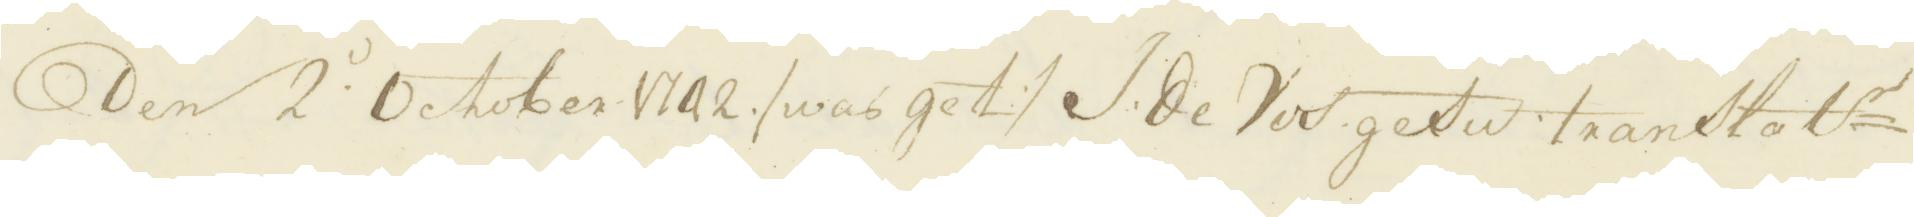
den 2:' October 1742. /was get:/ I: de Vos: gesw: translat=r
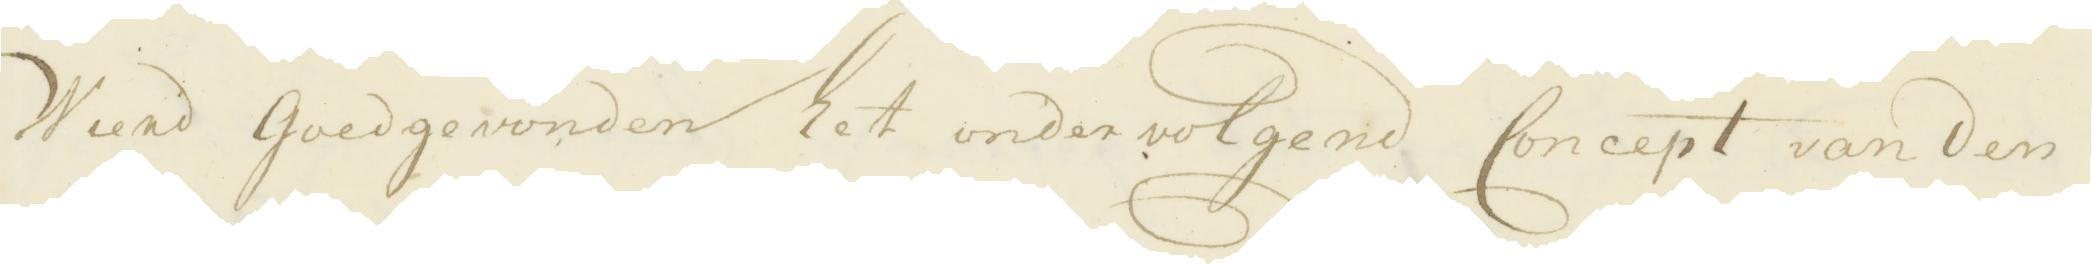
Wierd goedgevonden het ondervolgend Concept van den
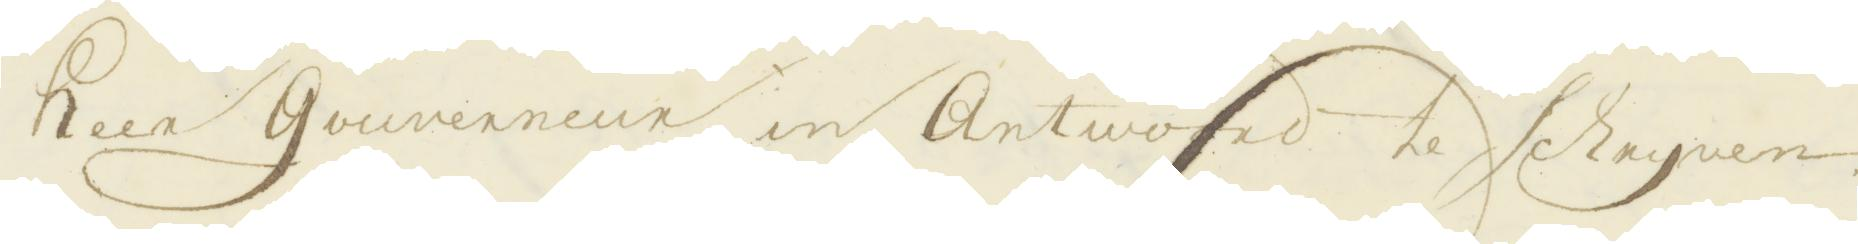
heer gouverneur in Antwoord te schryven
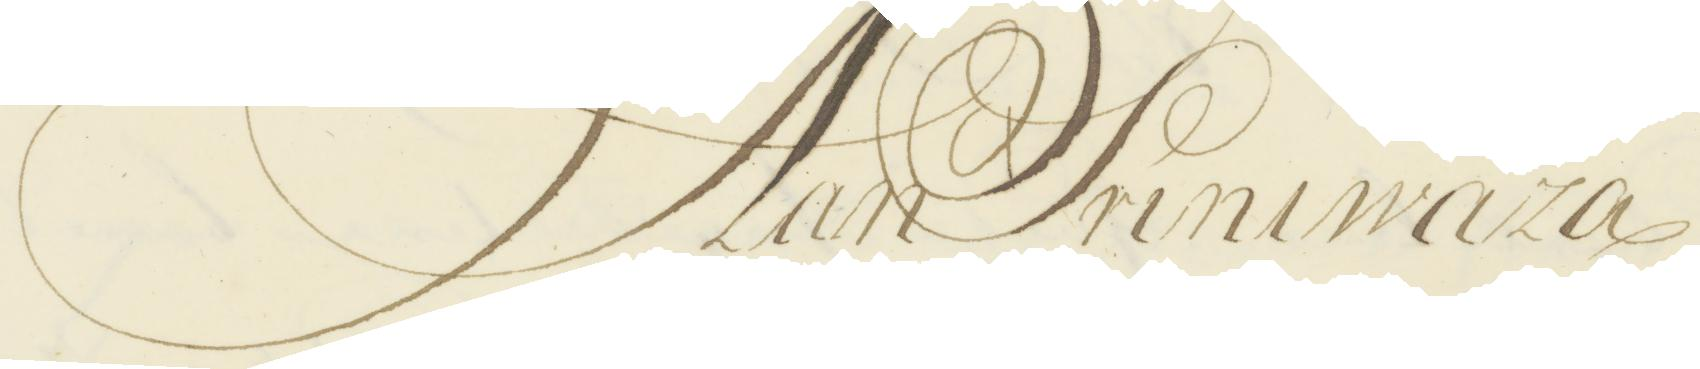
Aan Sriniwaza
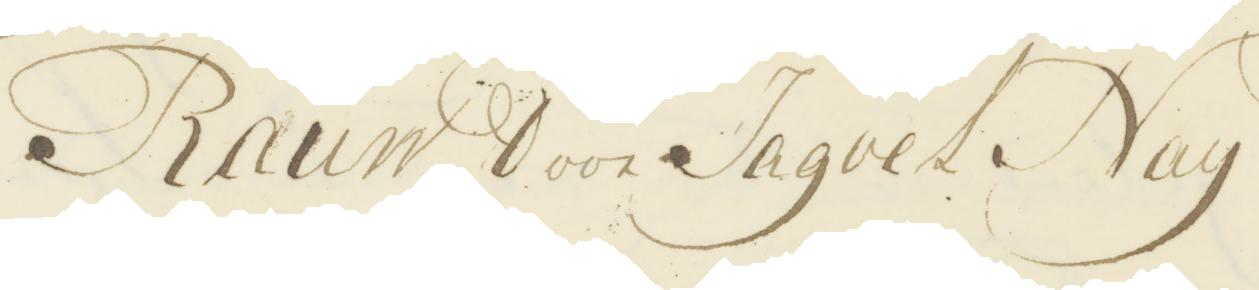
Rauw door Iagoel Nay
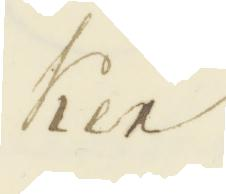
ker
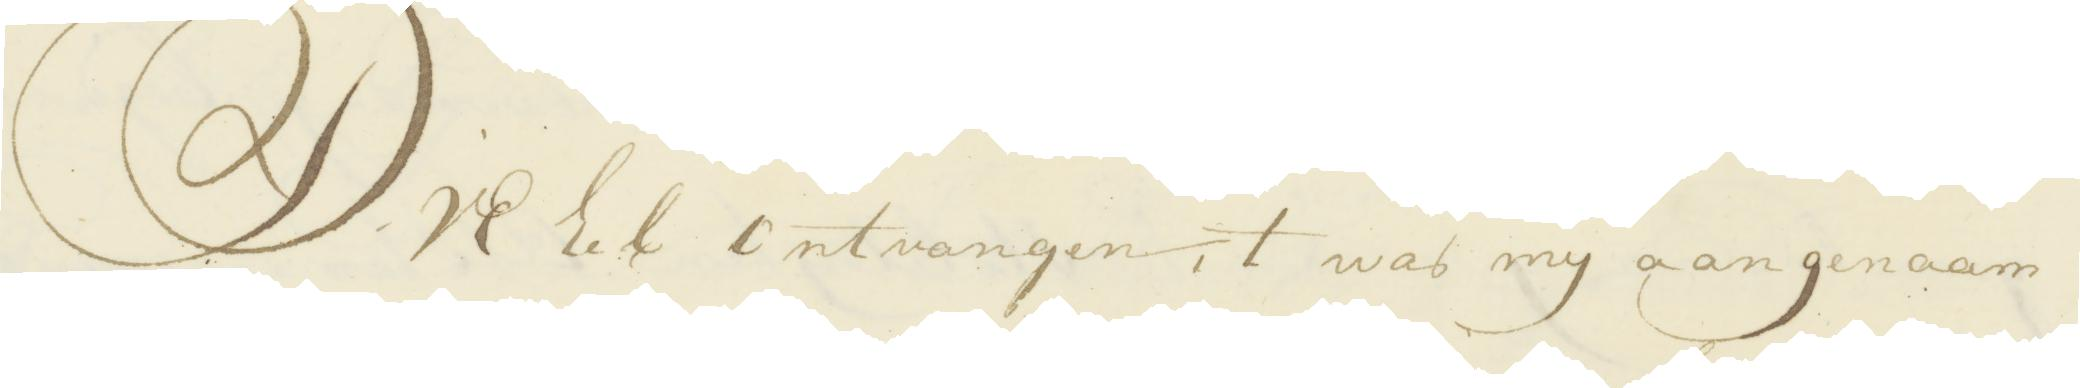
D. VE heb ontvangen ’t was my aan genaam
